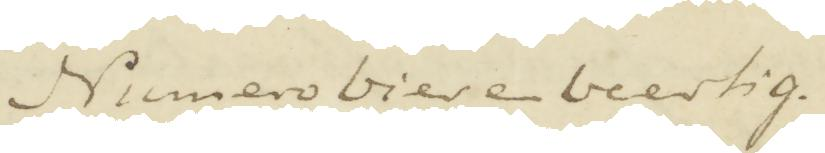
Numero vier en veertig.
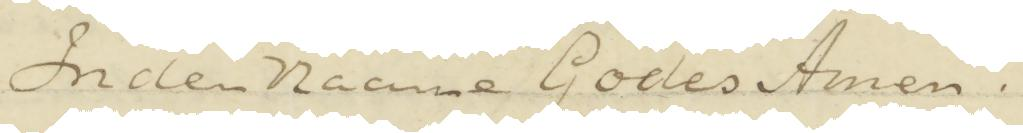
In den Name Godes Amen!
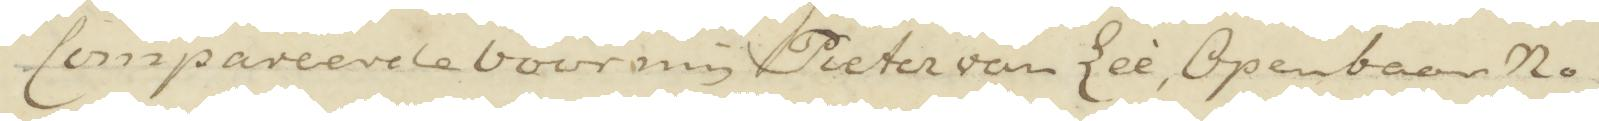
Compareerde voor mij Pieter van Leè, Openbaar Na
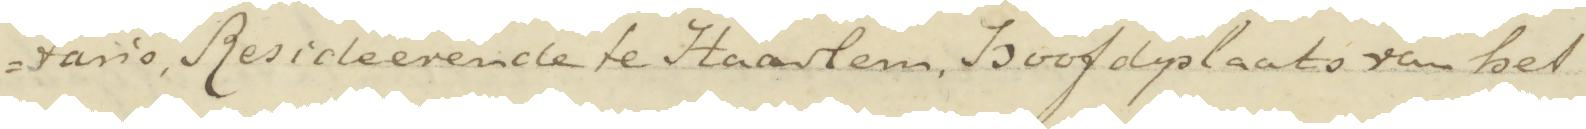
=taris, Resideerende te Haarlem, hoofdplaats van het
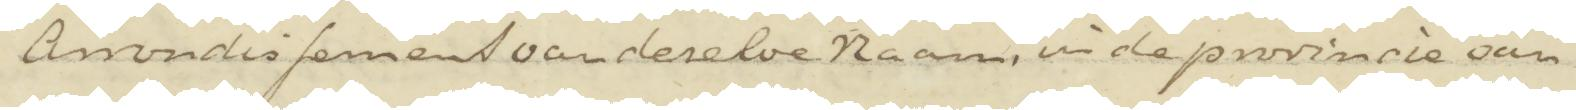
Arrondissement van dezelve Naam in de provincie van
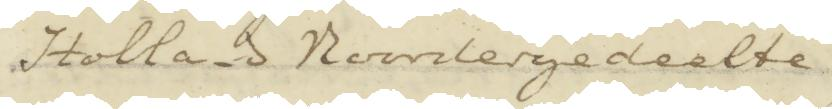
Holland Noordergedeelte
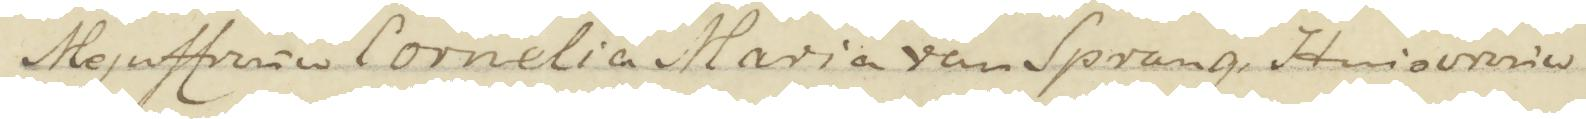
Mejuffrouw Cornelia Maria van Sprang, Huisvrouw
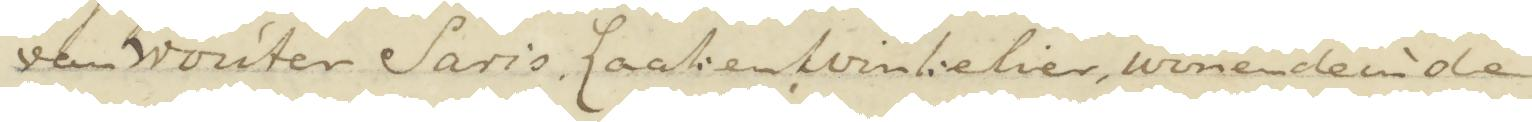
ven Wouter Saris, Laakenwinkelier, wonende in de
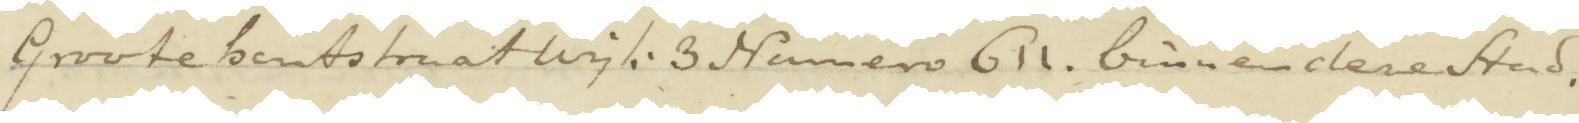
Groote bontstraat wijk 3 Numero 611. binnen deze stad.
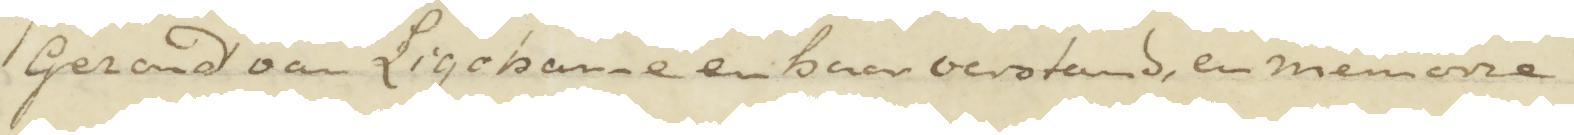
Gezond van Ligchame en haar verstand, en memorie
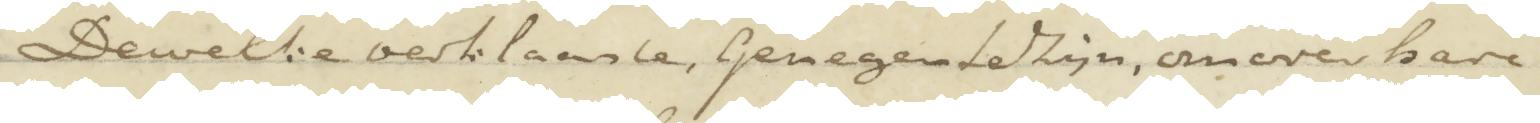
Dewelke verklaarde, Genegen te zijn, om over hare
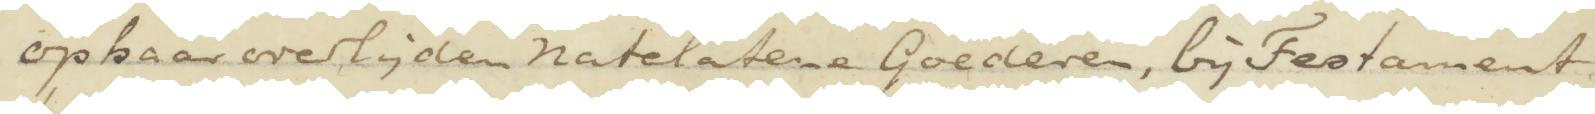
op heer overlijden natelatene Goederen, bij Testament
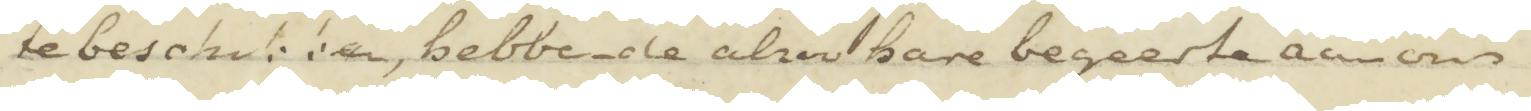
te beschikken, hebbende alzoo hare begeerte aan ons
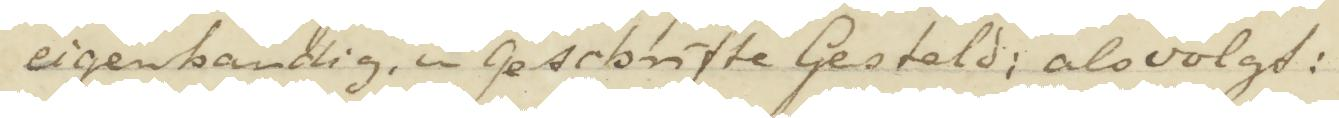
eigenhandig, in Geschrifte Gesteld; als volgt:
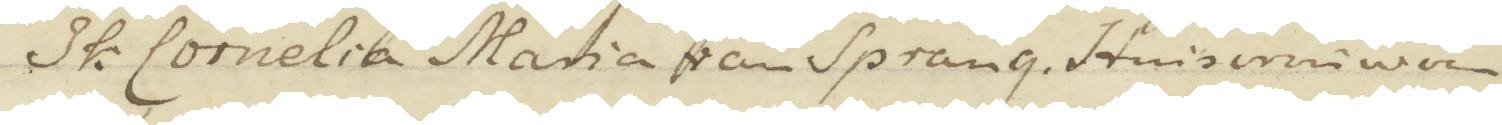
Ik Cornelia Maria van Sprang, Huisvrouw van
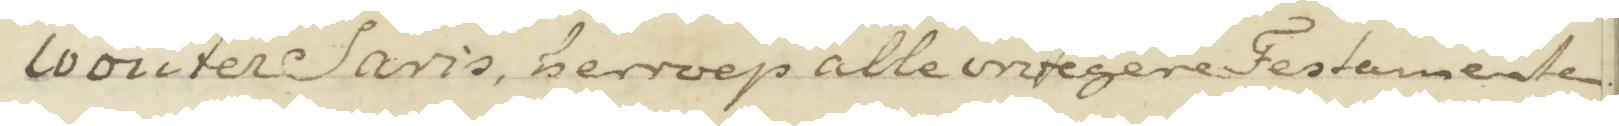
Wouter Saris, herroep alle vroegere Testamenten
